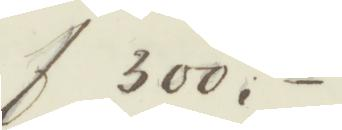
ƒ 300;—
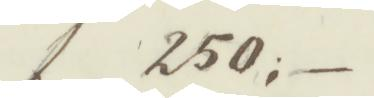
ƒ 250;—
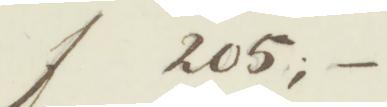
ƒ 205;—
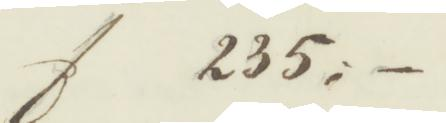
ƒ 235;—
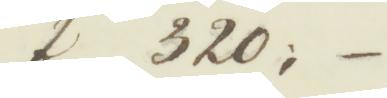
ƒ 320; —
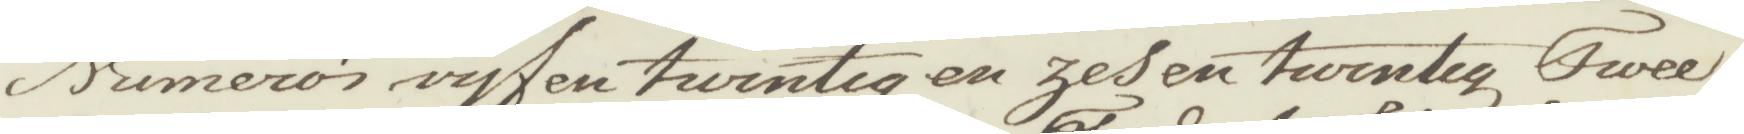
Numeros vyf en twintig en zes en twintig Twee
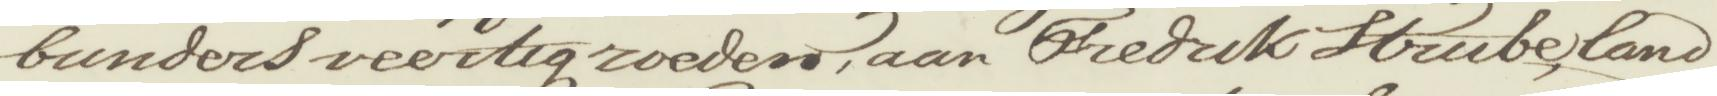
bunders veertig roeden, aan Fredrik Strube, land
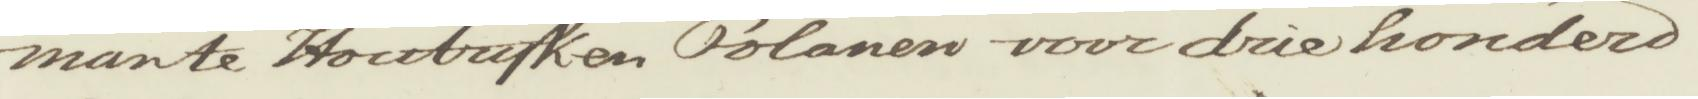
man te Houtyk en Polanen voor drie honderd
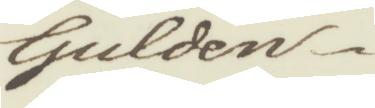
Gulden —
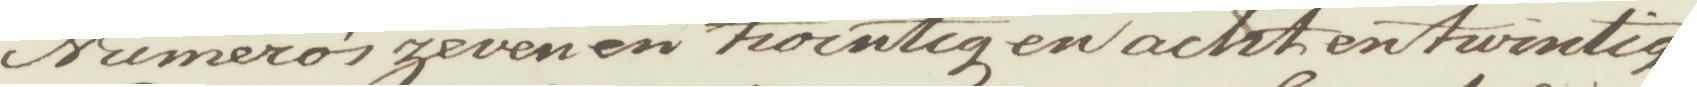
Numero's zeven en twintig en acht en twintig
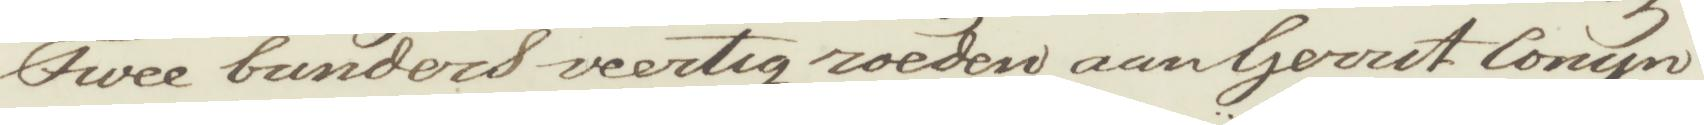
Twee bunders veertig roeden aan Gerrit Conijn
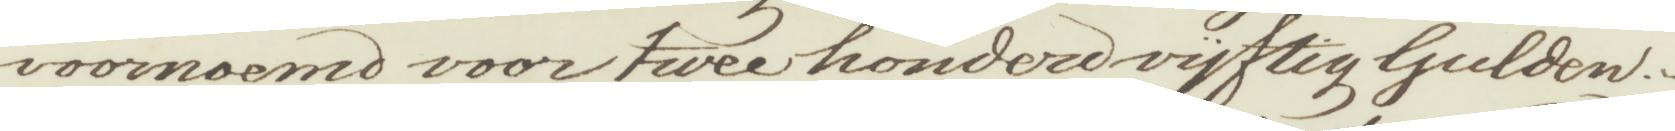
voornoemd voor twee honderd vijftig Gulden.
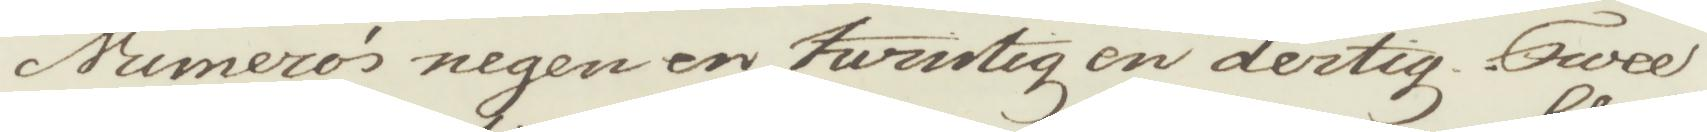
Numero's negen en twintig en dertig. Twee
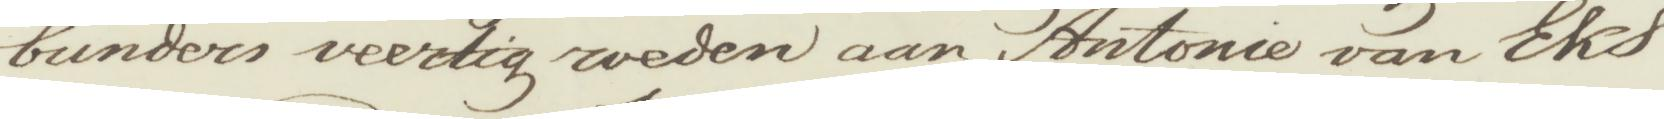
bunders veertig roeden aan Antonie van Eks
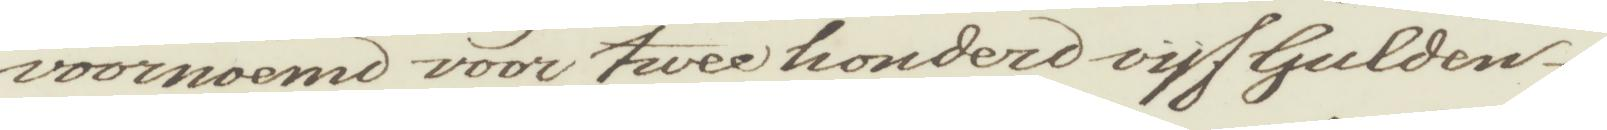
voornoemd voor twee honderd vijf Gulden—
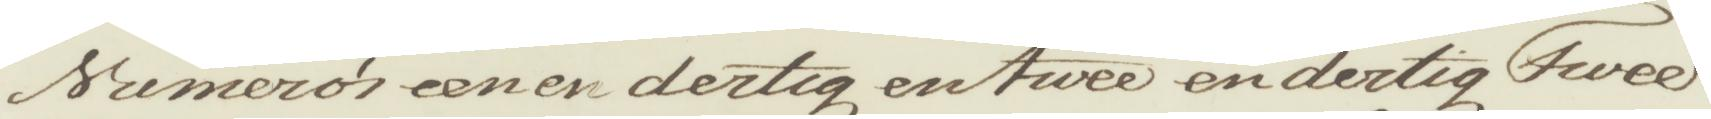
Numero's een en dertig en twee en dertig Twee
